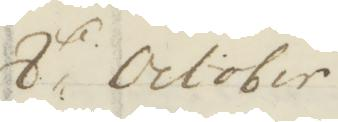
8„e October
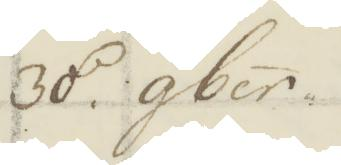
30.e 9ber„
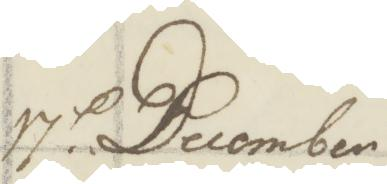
17:e December
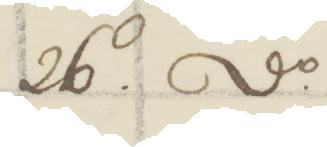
26.' d.o
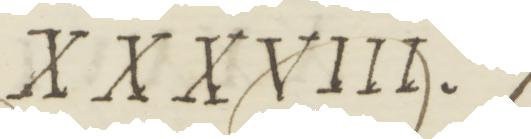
XXXVIII.
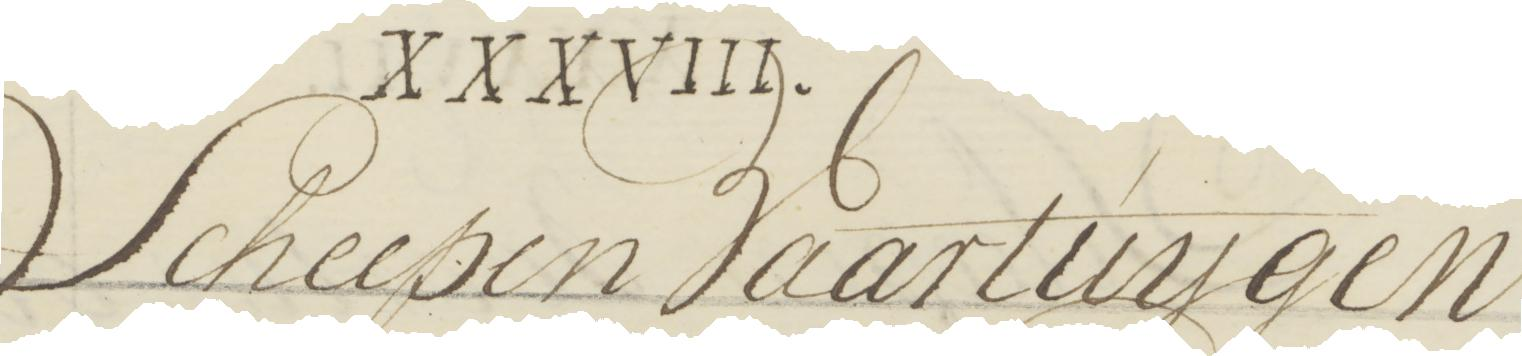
Scheepen Vaartuygen
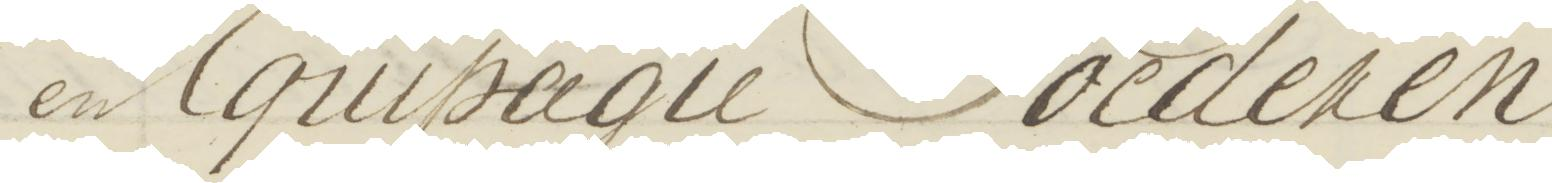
en Equipagie Goederen
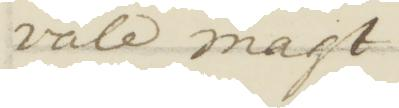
vale magt
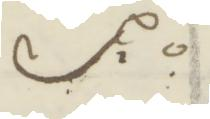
F.o
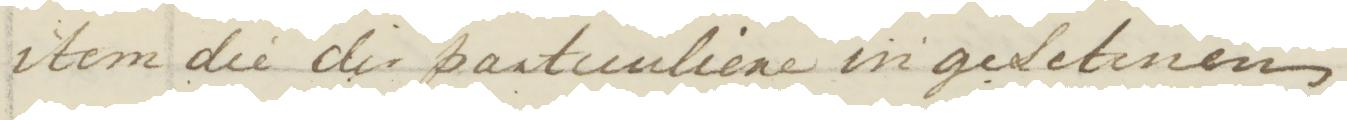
item die die particuliere ingesetenen
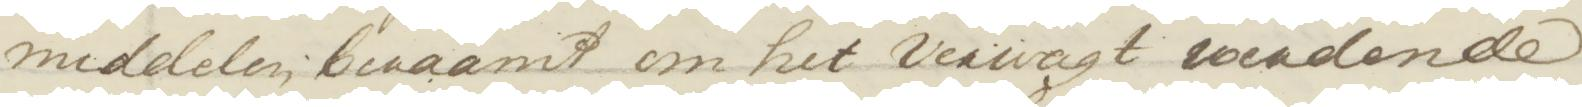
middelen beraamt om het verwagt werdende
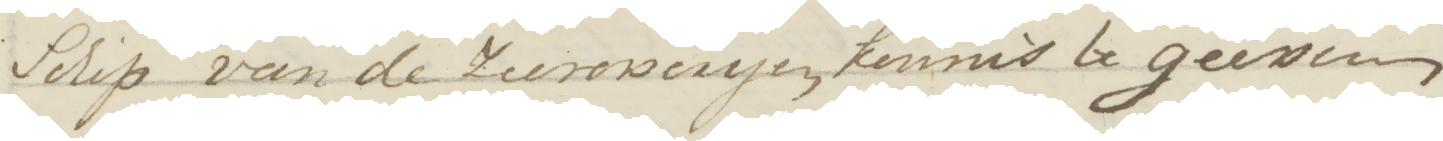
Schip van de Zeeroveryen kennis te geeven
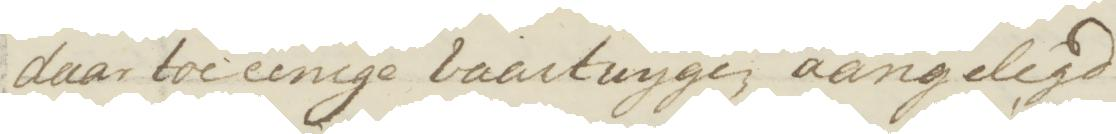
daar toe eenige vaartuygen aangelegd
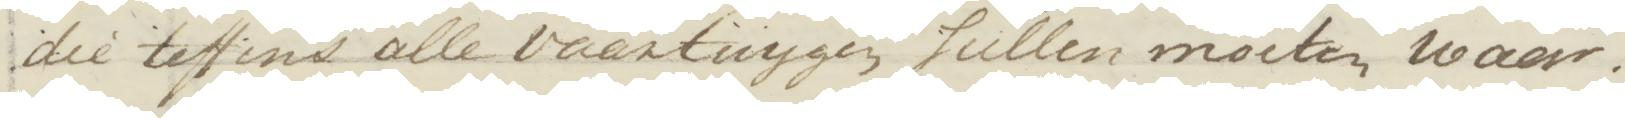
die teffens alle vaartuygen Zullen moeten waar.
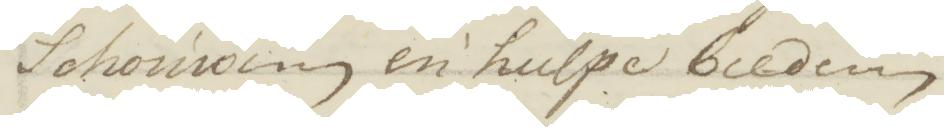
Schouwen en hulpe bieden
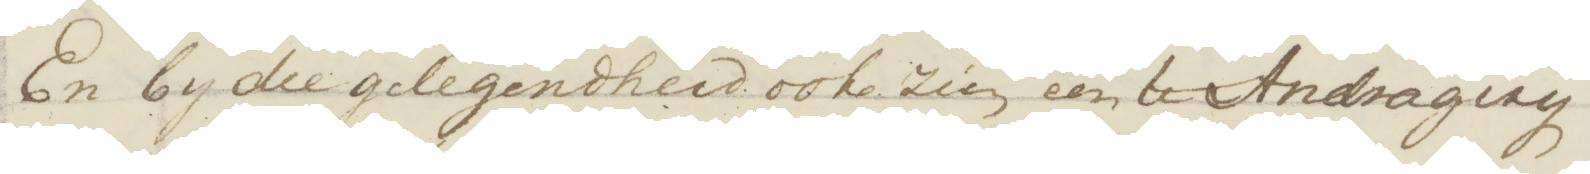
En by die gelegendheid ook zien een te Andragiry
